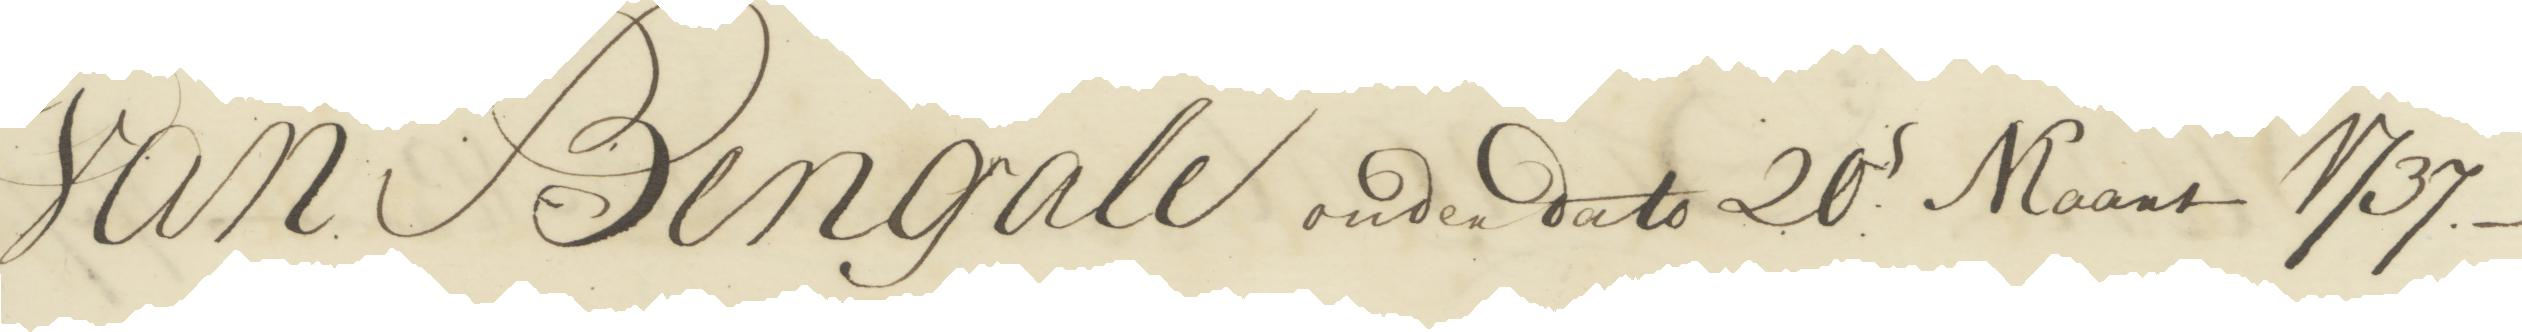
Van Bengale onder dato 20:' Maart 1737. —
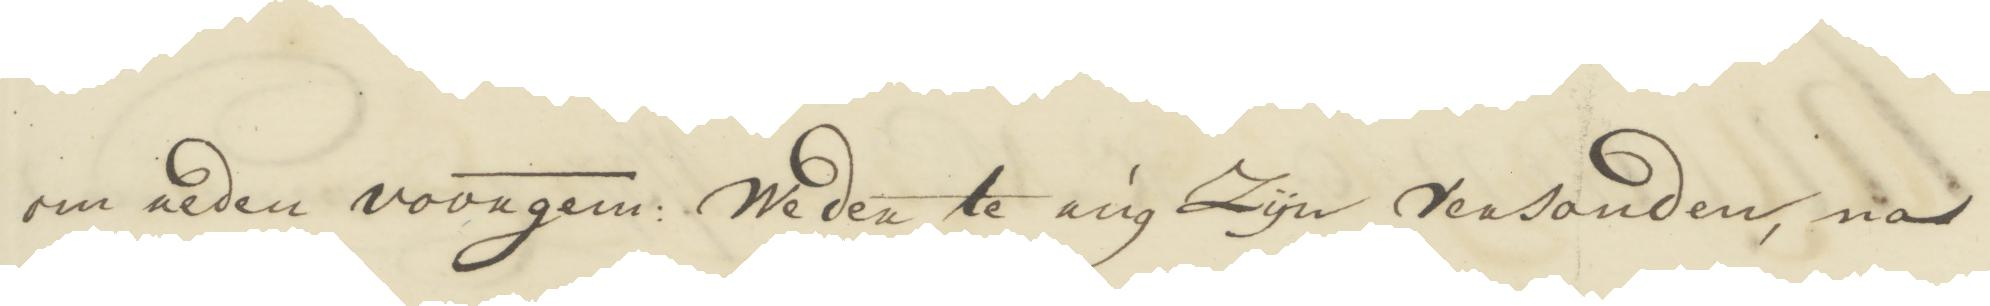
om reden voorgem: weder te rug zijn versonden, na
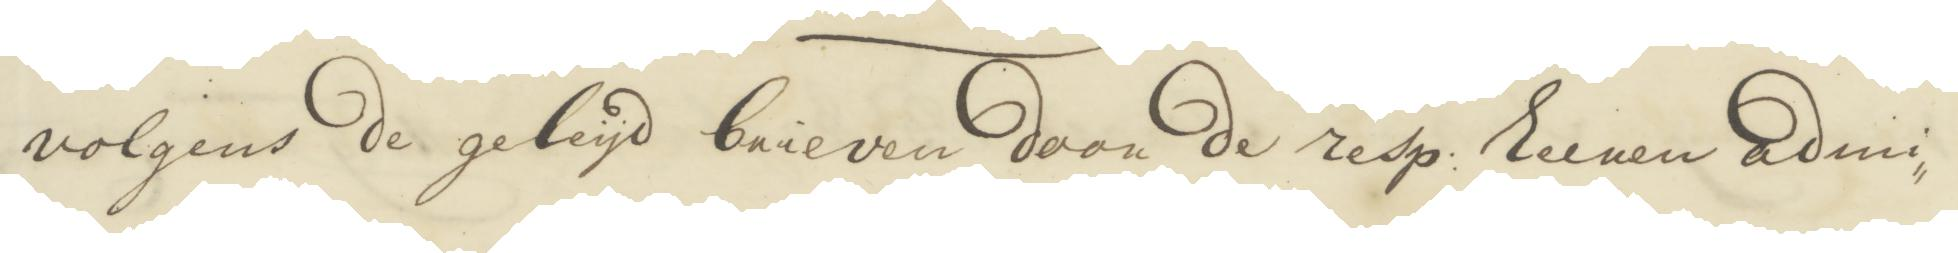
volgens de geleijd brieven door de resp: heeren admi„
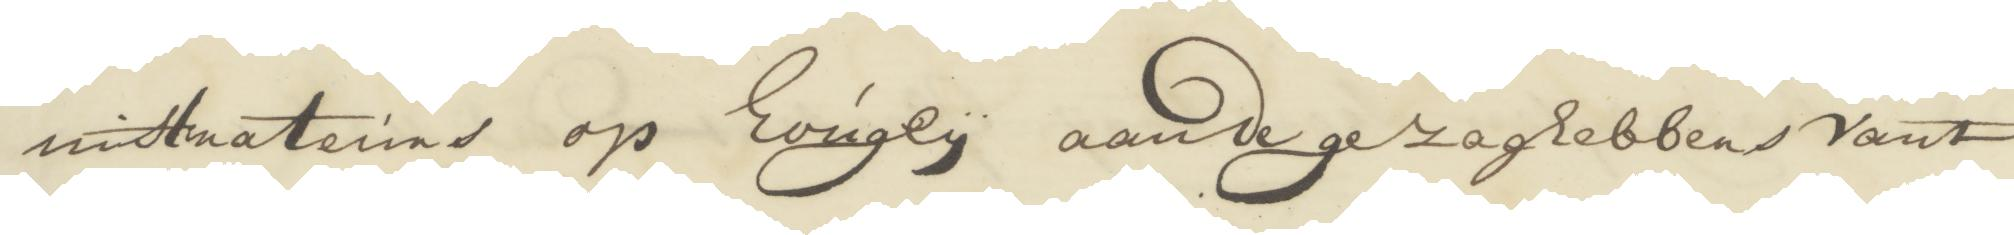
nistrateurs op houglij aan de gezaghebbers van't
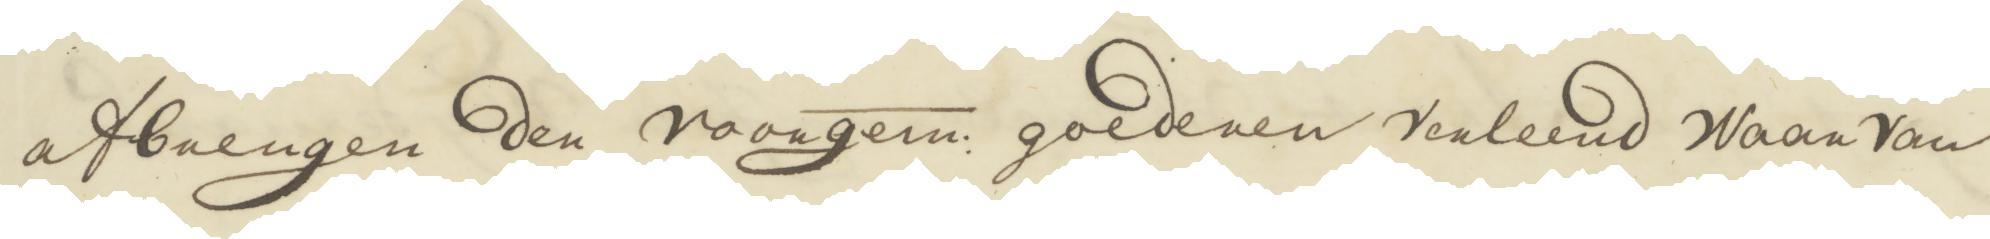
afbrengen den voorgem: goederen verleend waar van
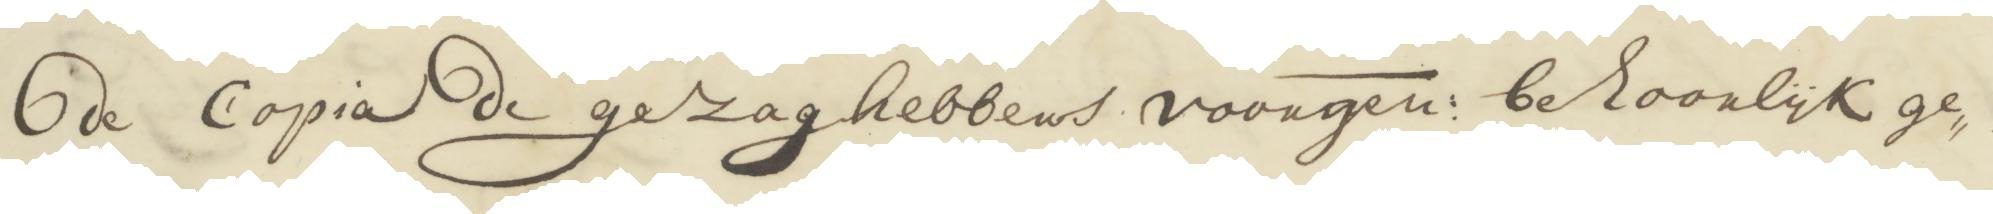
de Copia de gezaghebbers voorgen: behoorlijk ge„
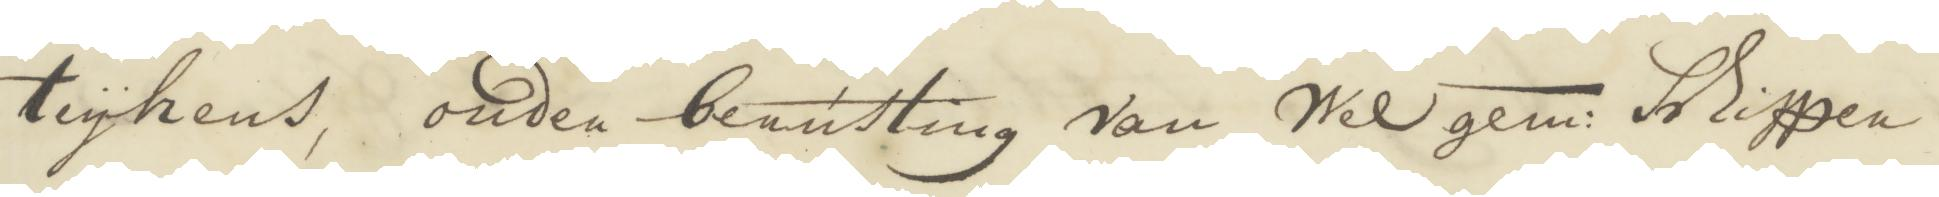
teijkens, onder berusting van wel gem: schipper
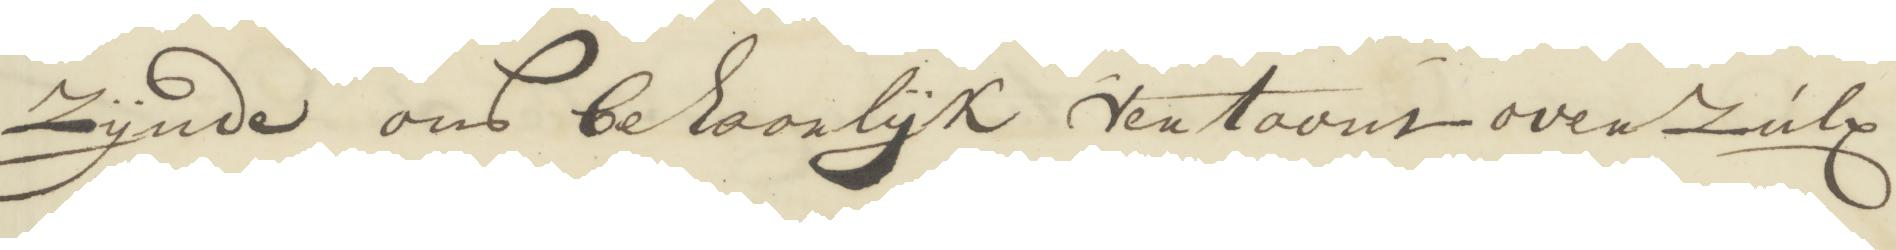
zijnde ons behoorlijk vertoont over zulx
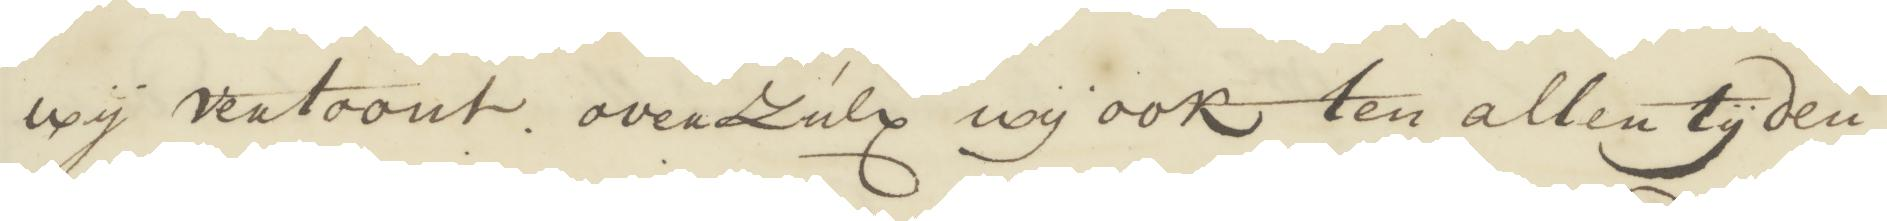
wij vertoont, over zulx wij ook ten allen tijden
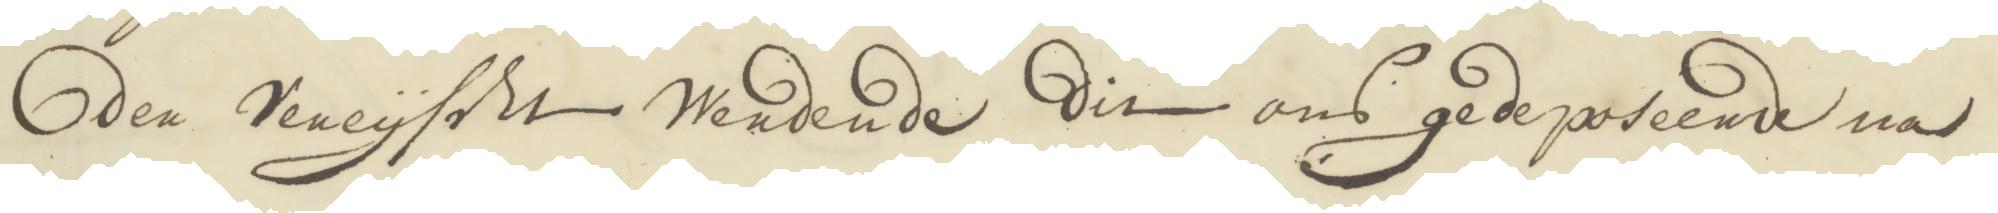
der vereijscht werdende dit ons gedeposeerde na
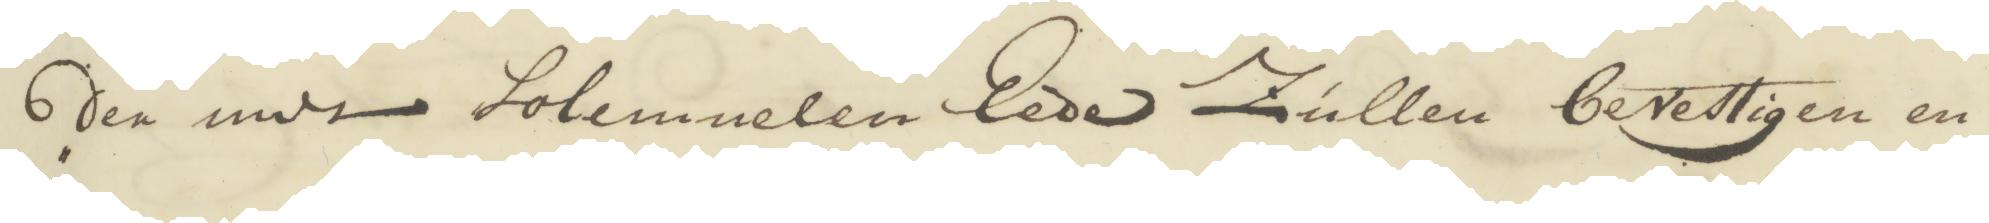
der met solemnelen Eede zullen bevestigen en
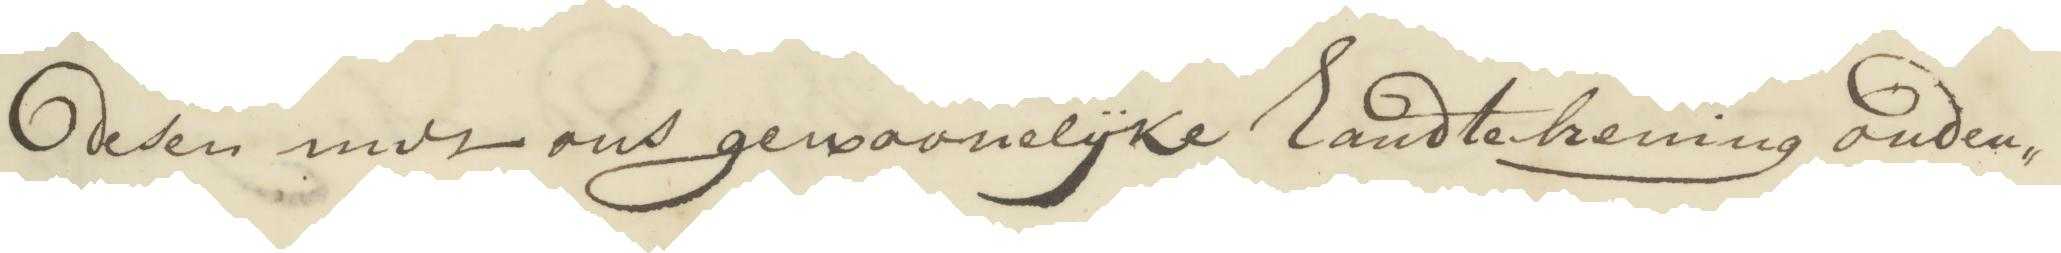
desen met ons gewoonelijke handtekening onder„
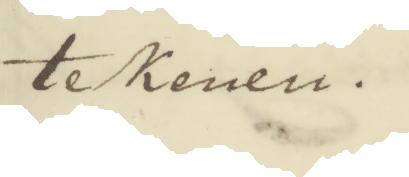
tekenen.
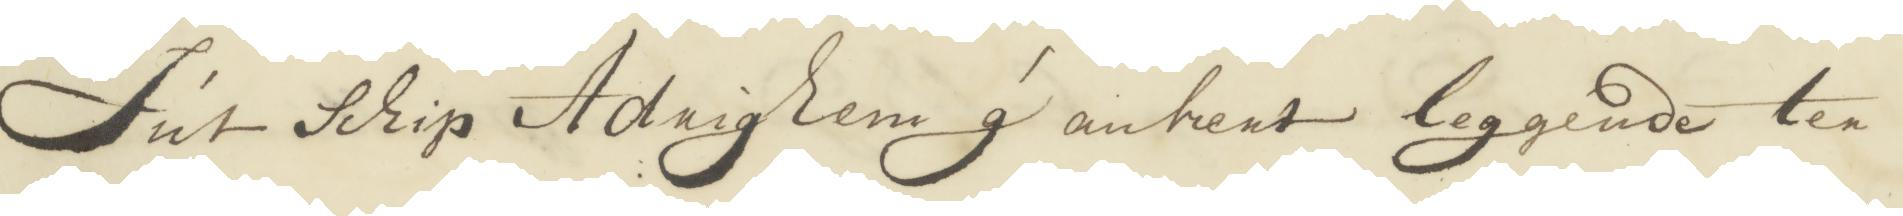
In't schip Adrighem g’ankert leggende ter
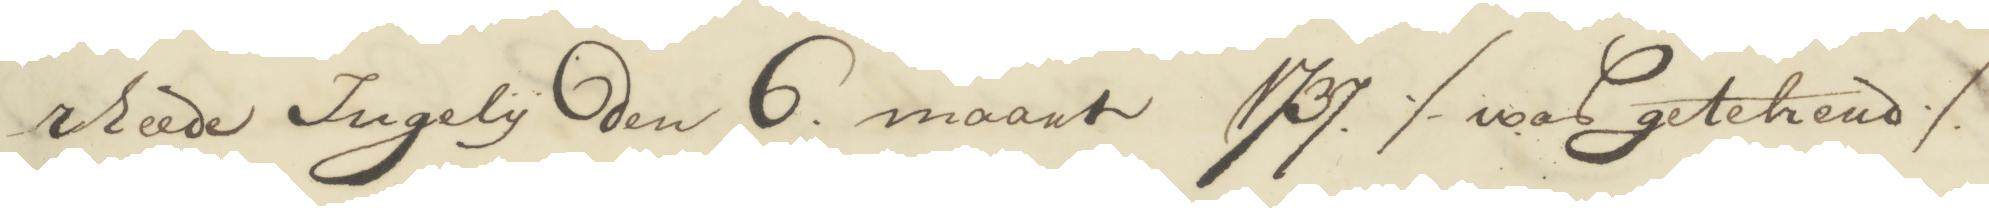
rheede Ingelij den 6. maart 1737. ./. was getekend ./.
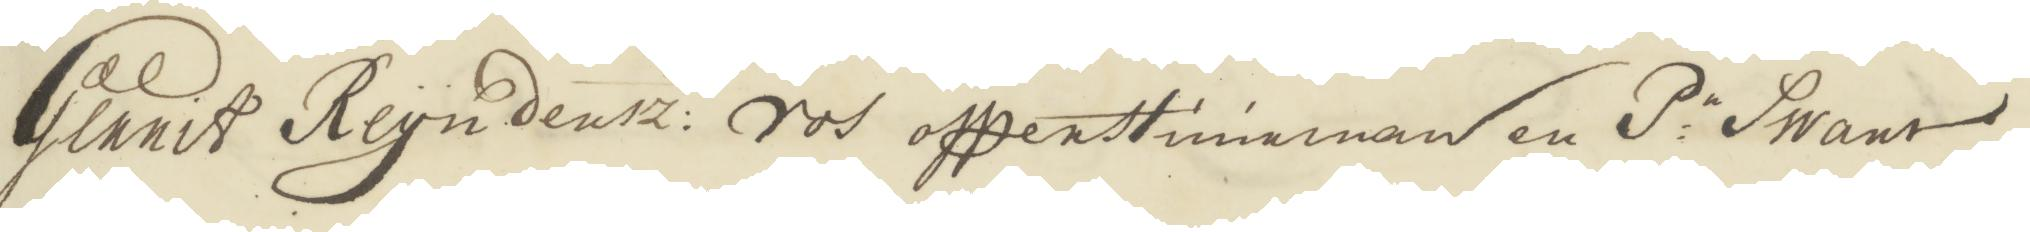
Gerrit Reijndersz: vos opperstuurman en P:r swart
